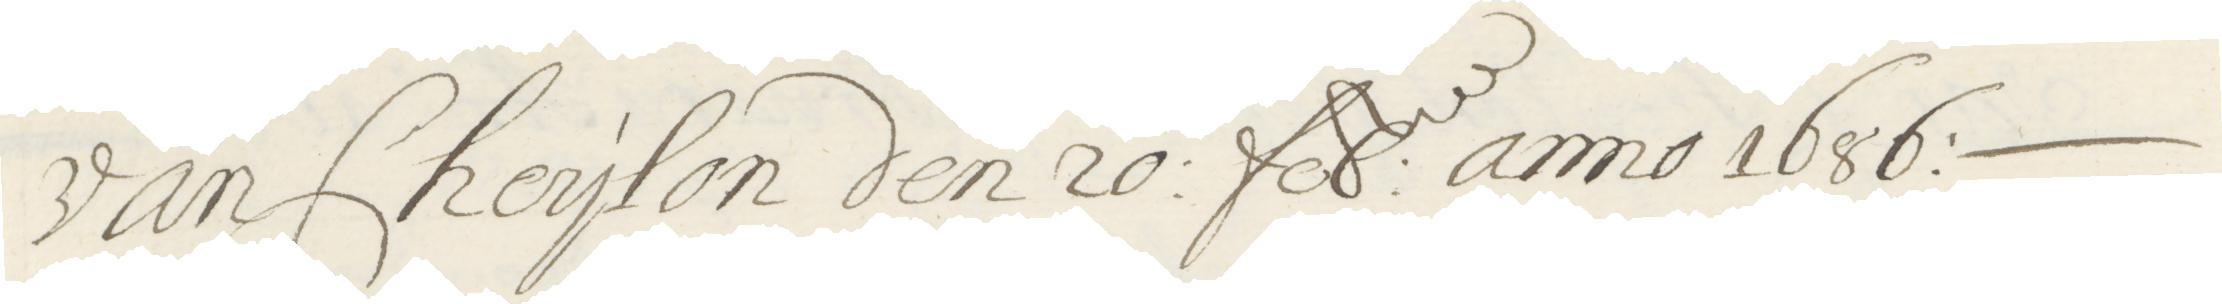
Van Cheijlon den 20:e feb: anno 1686: —
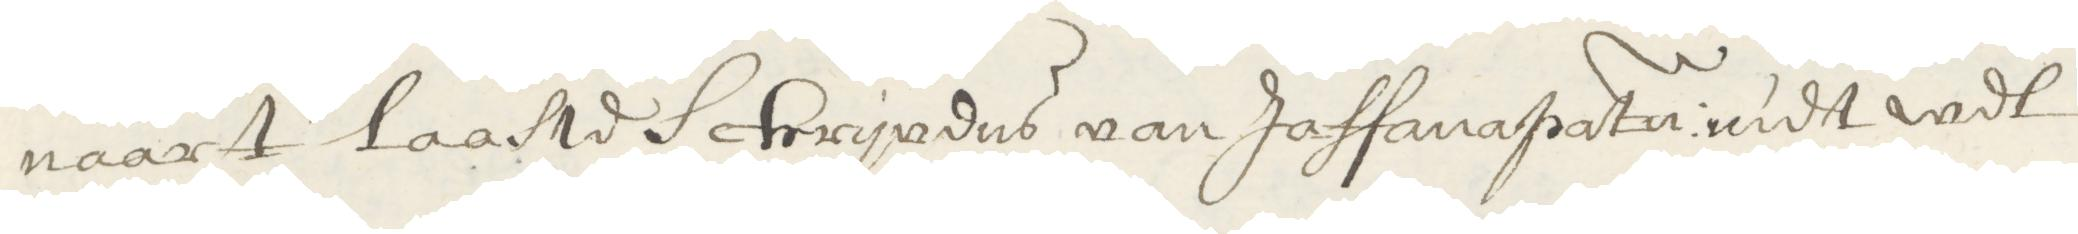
naar t' laaste schrijvens van Jaffanapatn: niet wel
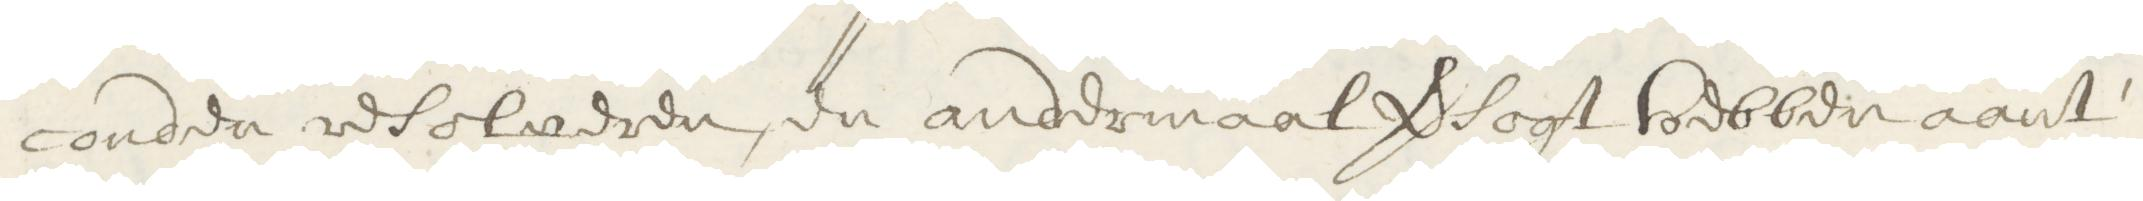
conden resolveren, en andermaal versogt hebben aant'
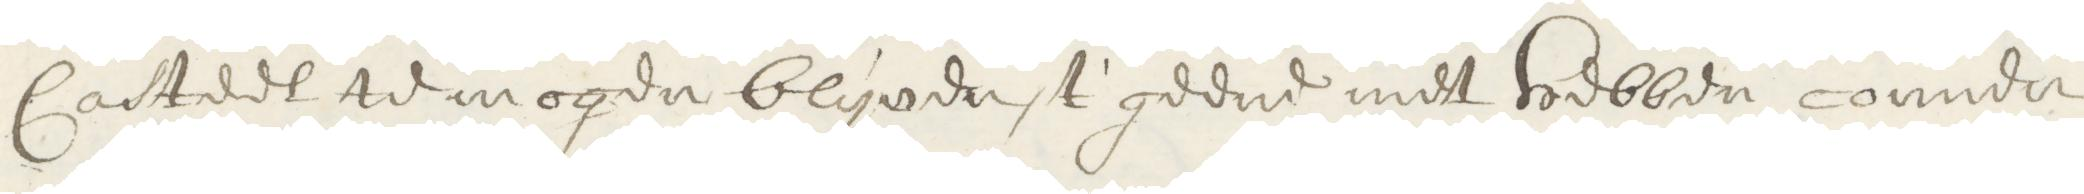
Casteel te mogen blijven, t' geene niet hebben connen
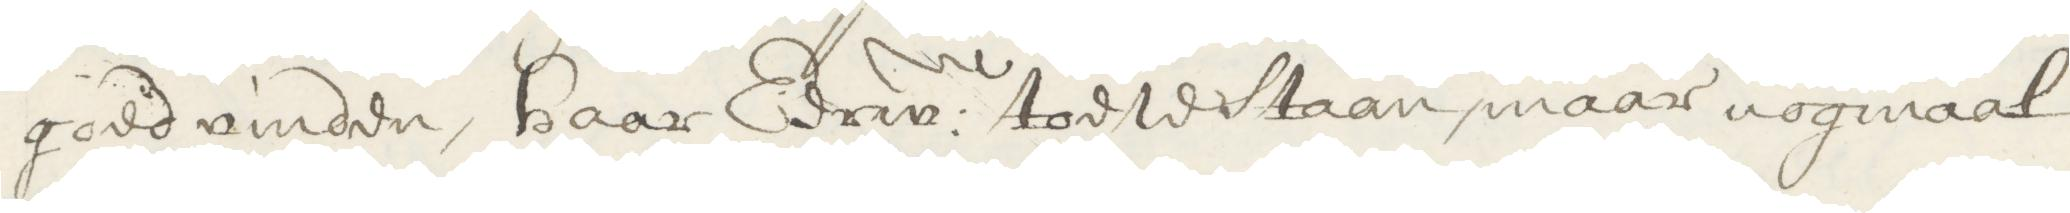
goed vinden, haar Eerw: toe te staan, maar nogmaal
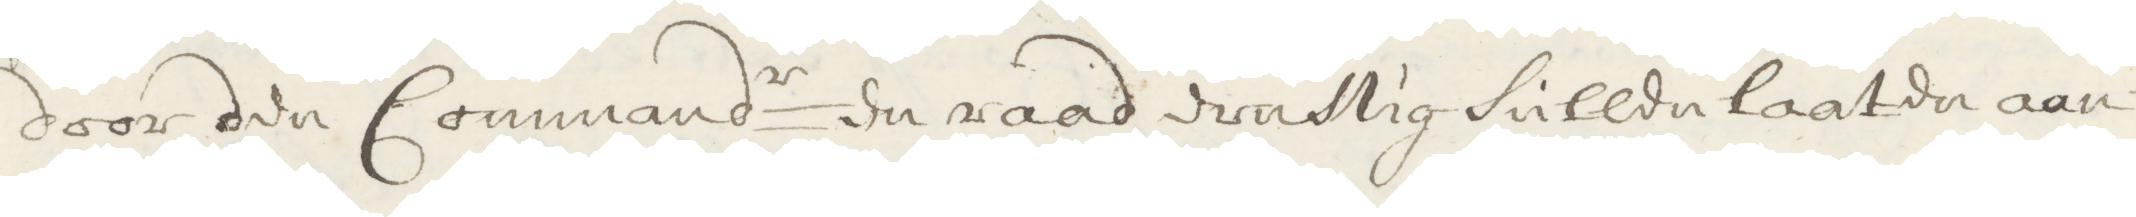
door den Command=r en raad ernstig sullen laaten aan
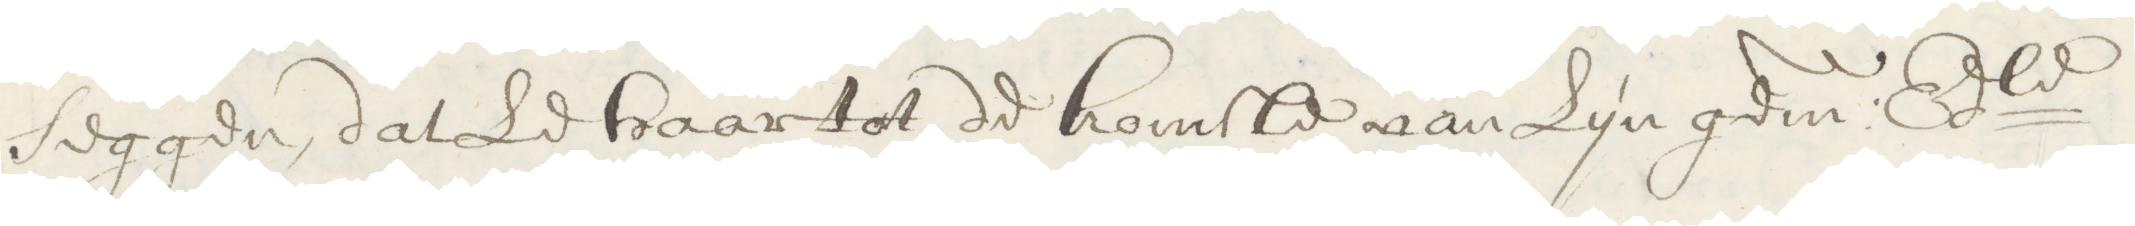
seggen, dat ze haar tot de komste van zijn gem: Ed=le
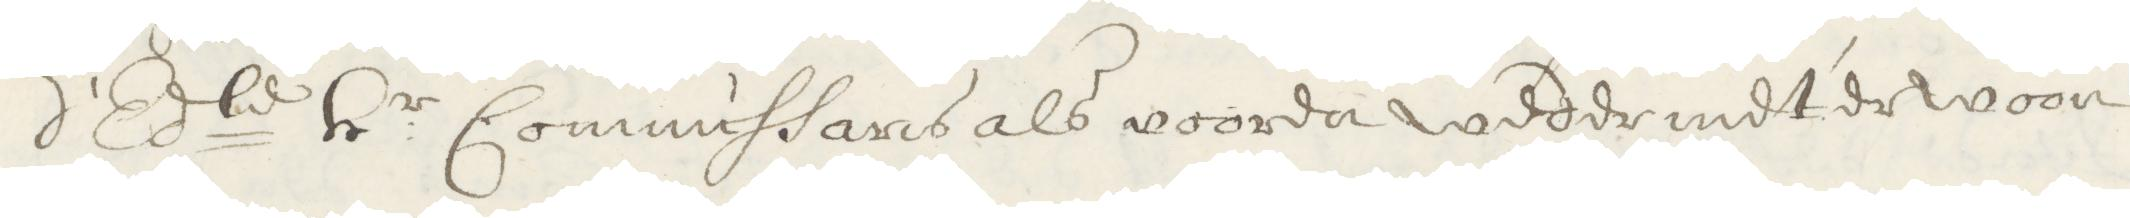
d' Ed=le h:r Commissaris als vooren weder met 'erwoon
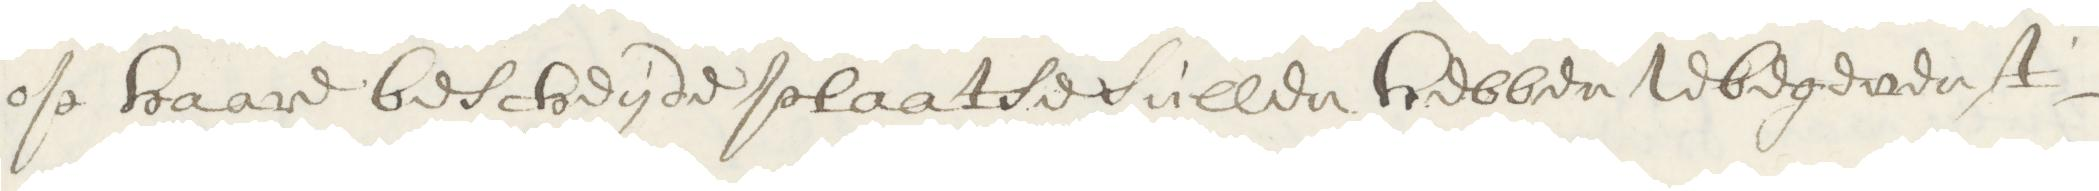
op haare bescheijde plaatse sullen hebben te begeven t'
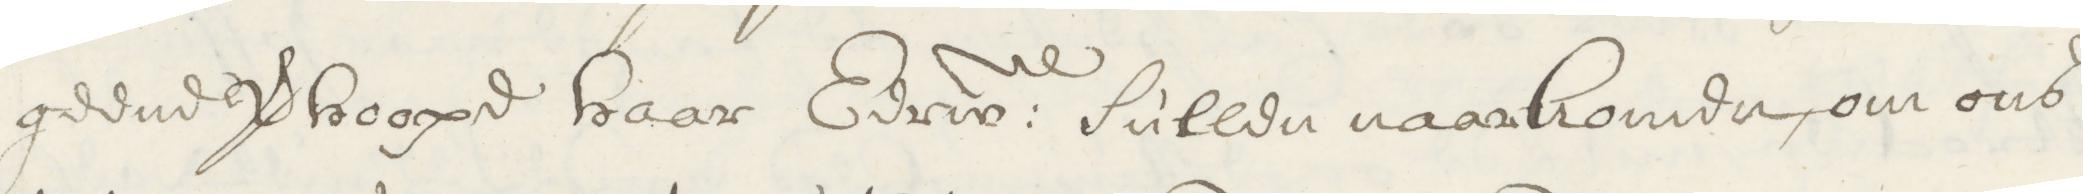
geene verhoope haar Eerw: sullen naarkomen, om ons
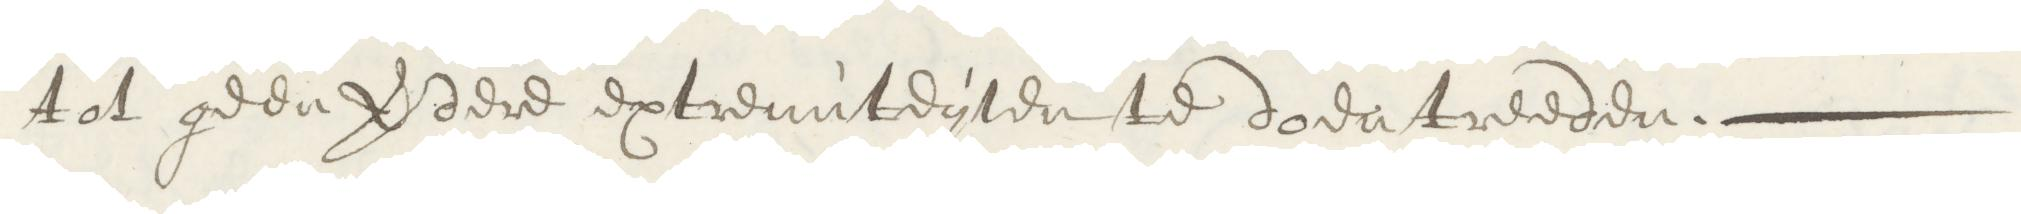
tot geen verdere extremiteijten te doen treeden. —
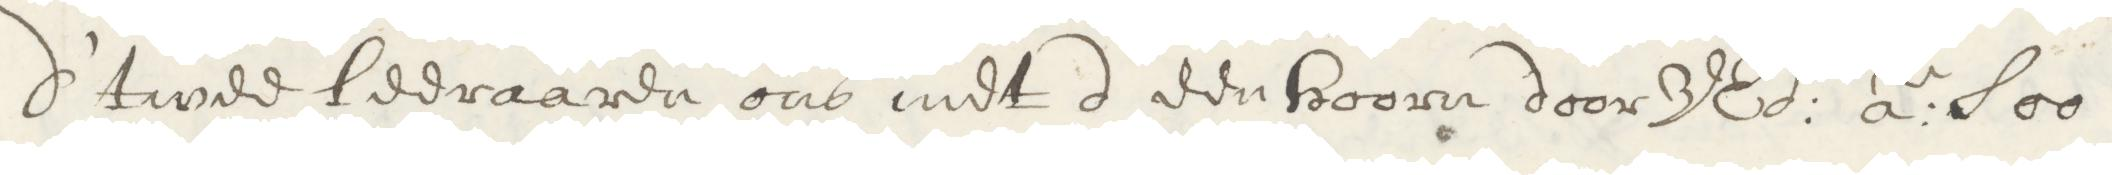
d’ twee leeraaren ons met d' eenhoorn door VEd:le a: soo
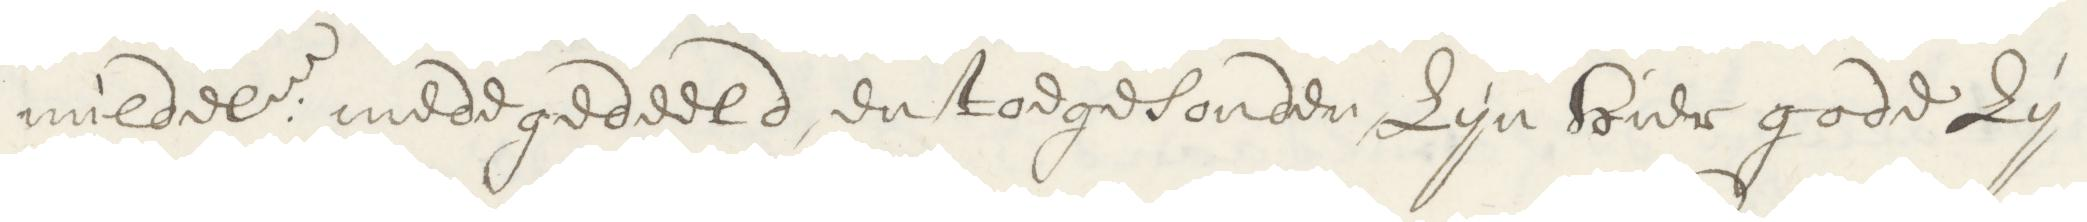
mildelijk mede gedeeld, en toegesonden, zijn hier gode zij
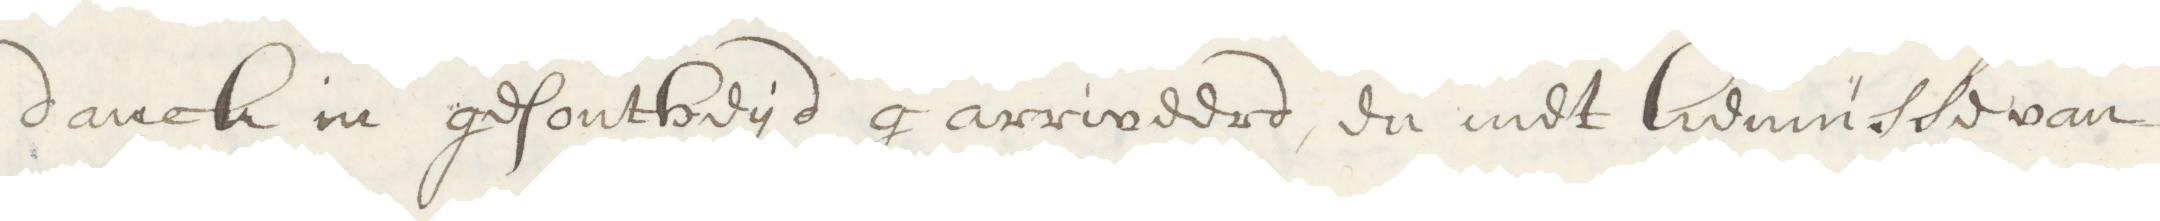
danck in gesontheijd g’arriveerd, en met kennisse van
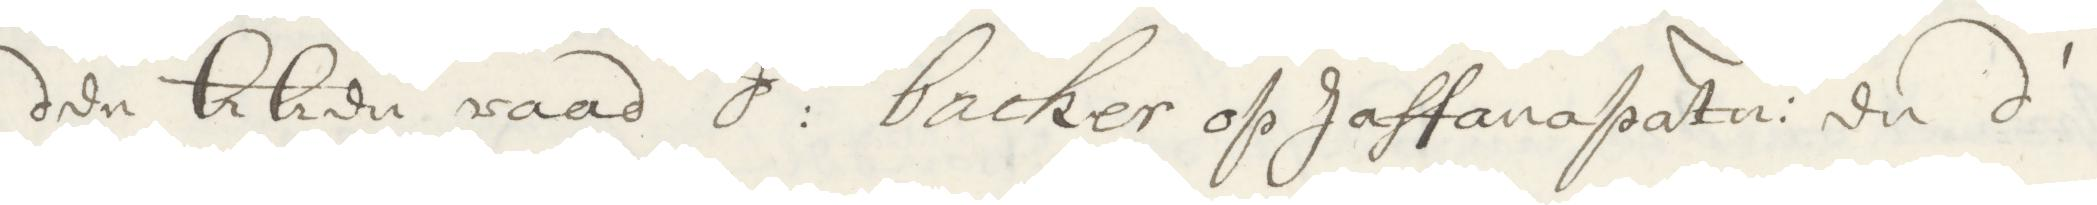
den kken raad d:ne backer op Jaffanapatn: en d'
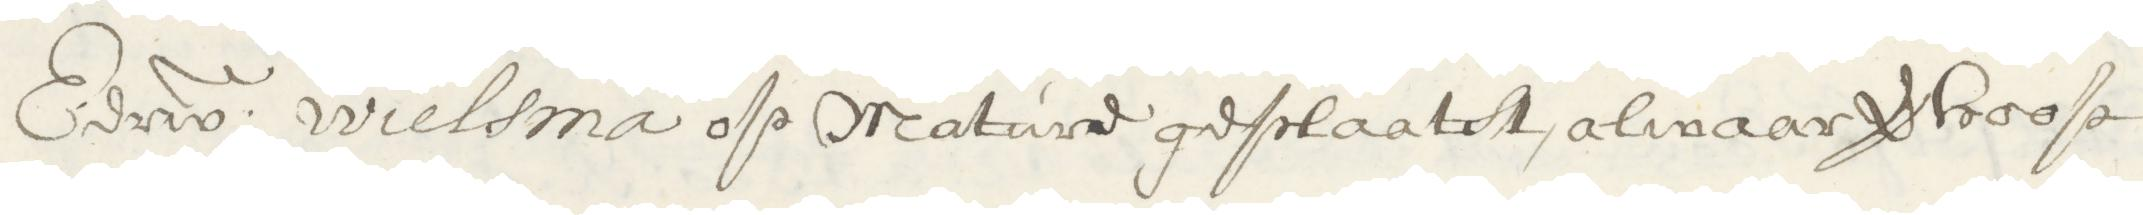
Eerw: wielsma op Mature geplaatst, alwaar verhoop
